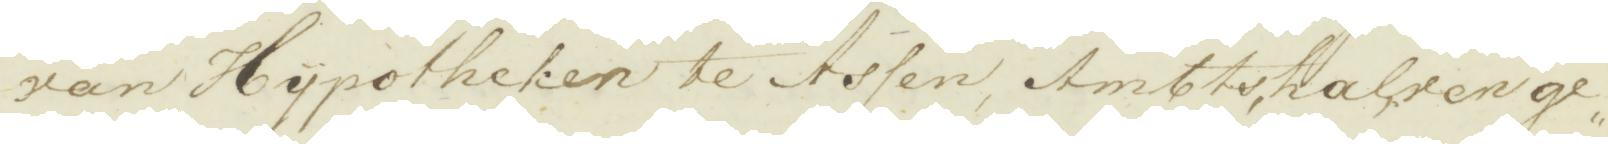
van Hijpotheken te Assen, Ambtshalven ge
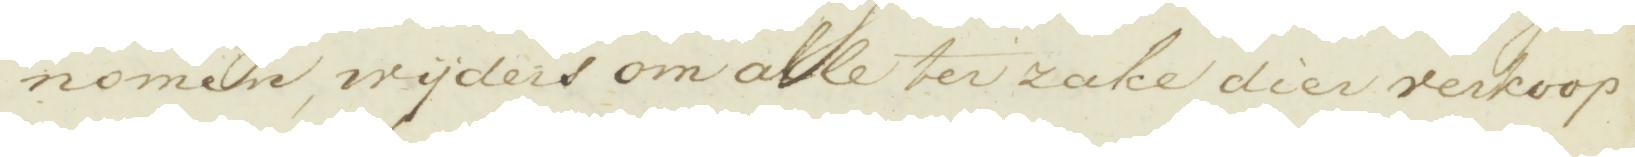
nomen, wijders om alle ter zake dier verkoop
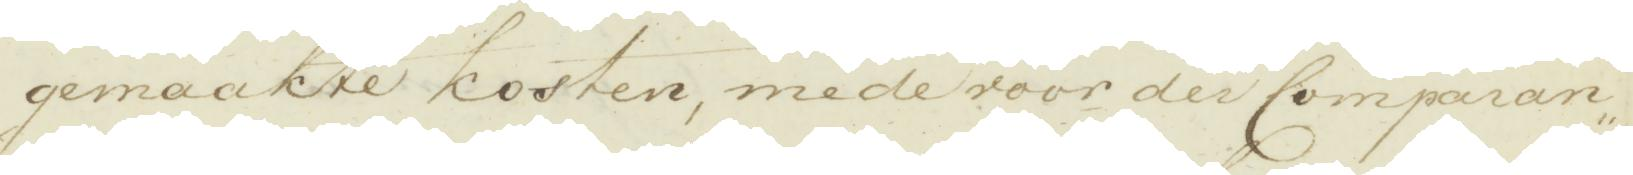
gemaakte kosten, mede voor der Comparan„
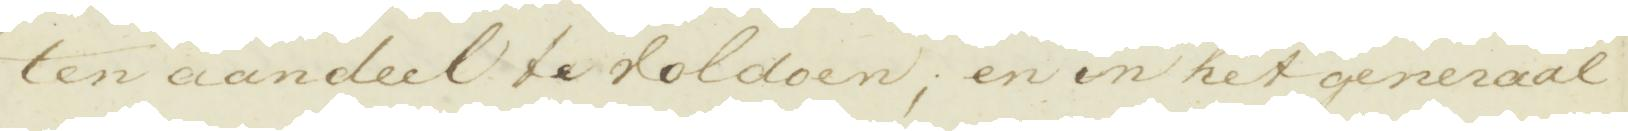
ten aandeel te voldoen; en in het generaal
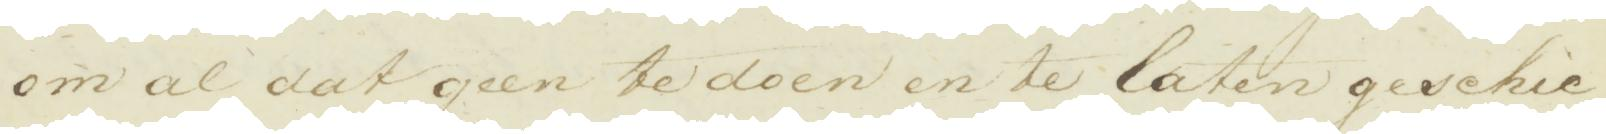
om al dat geen te doen en te laten geschie
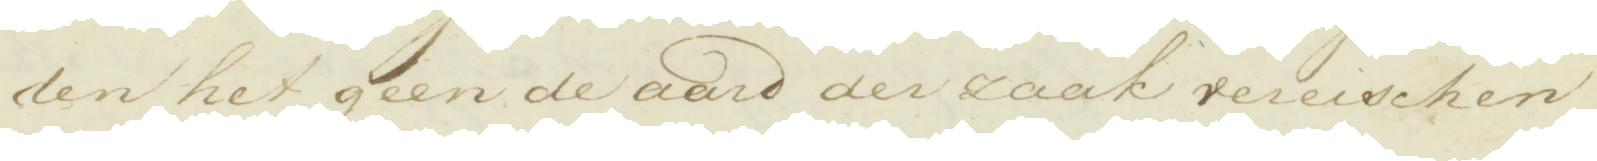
den het geen de aard der zaak vereischen
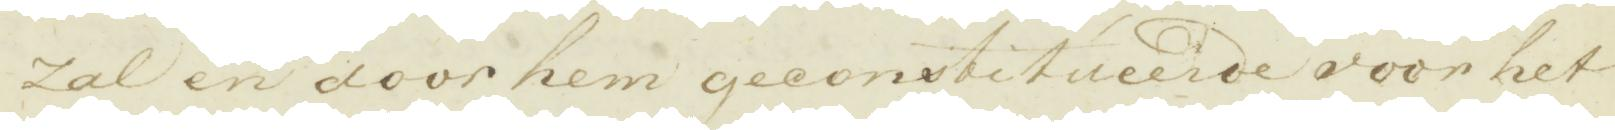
zal en door hem geconstitueerde voor het
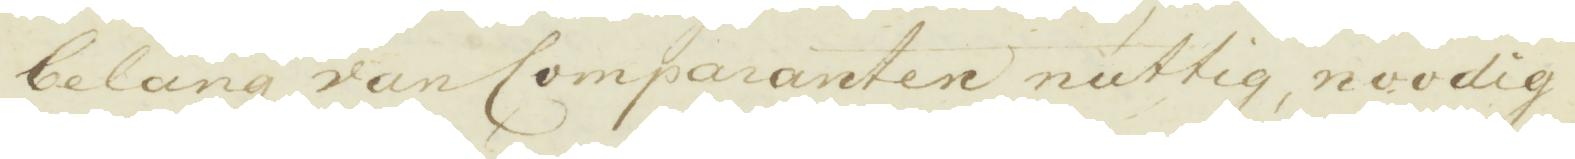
belang van Comparanten nuttig, noodig
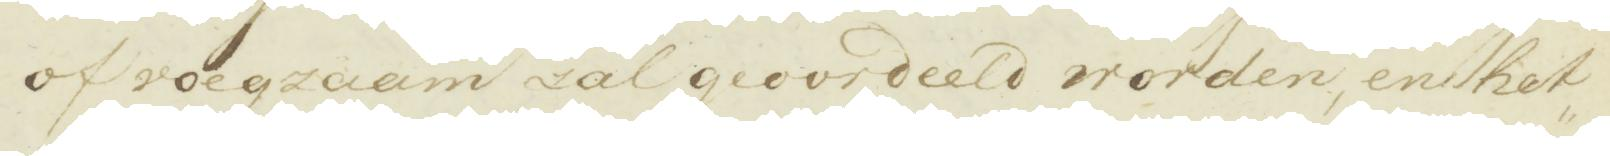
of voegzaam zal geoordeeld worden, en het„
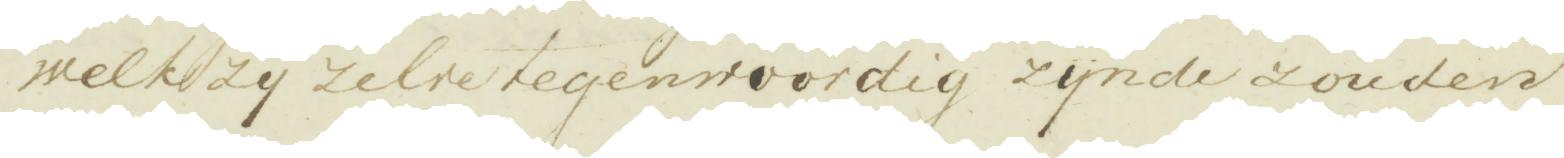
welk zij zelve tegenwoordig zijnde zouden
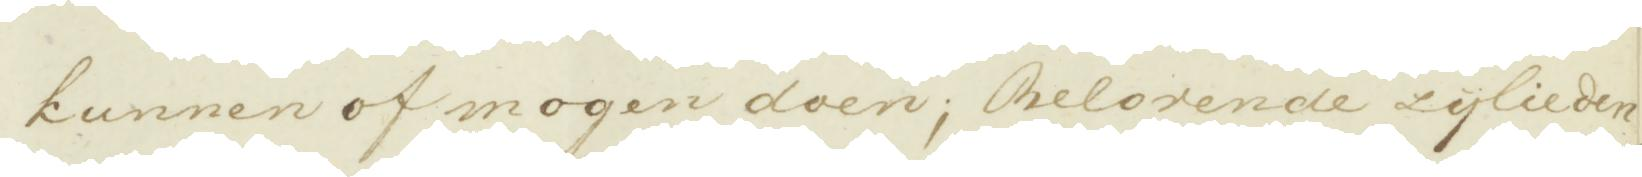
kunnen of mogen doen; Belovende zijlieden
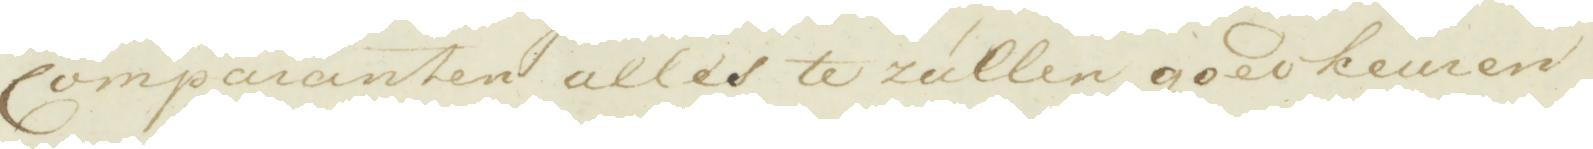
Comparanten alles te zullen goedkeuren
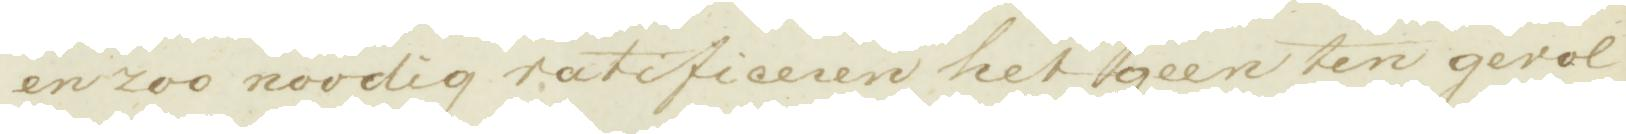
en zoo noodig ratificeren het geen ten gevol
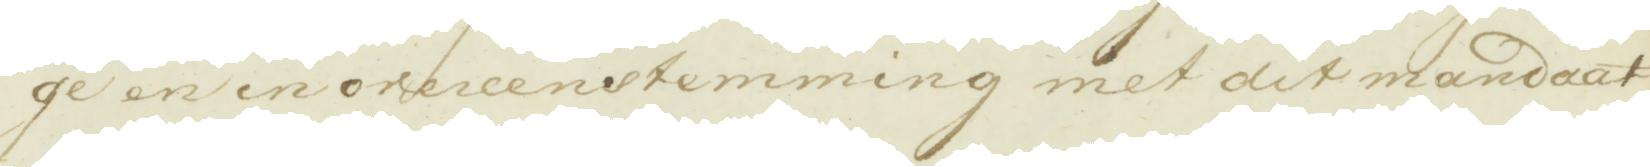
ge en in overeenstemming met dit mandaat
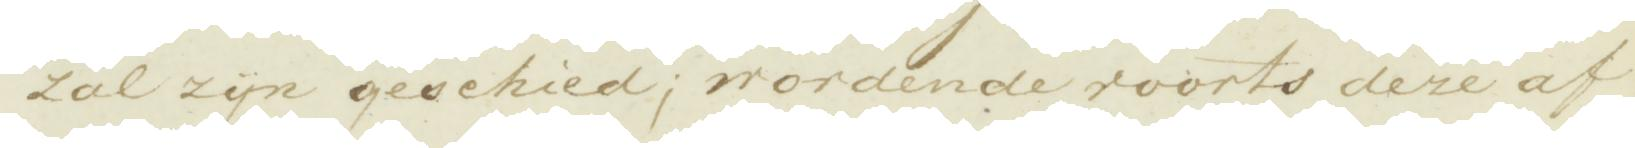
zal zijn geschied; wordende voorts deze af
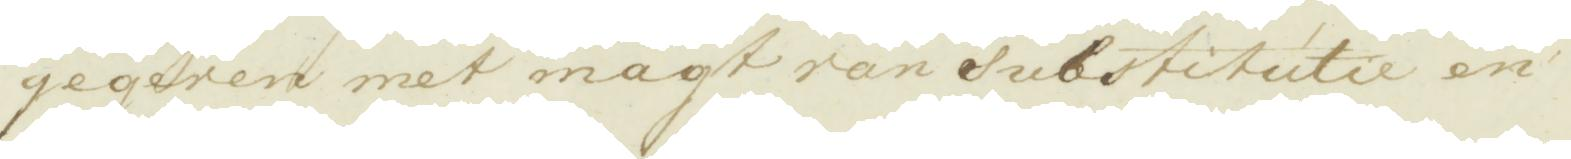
gegeven met magt van substitutie en
